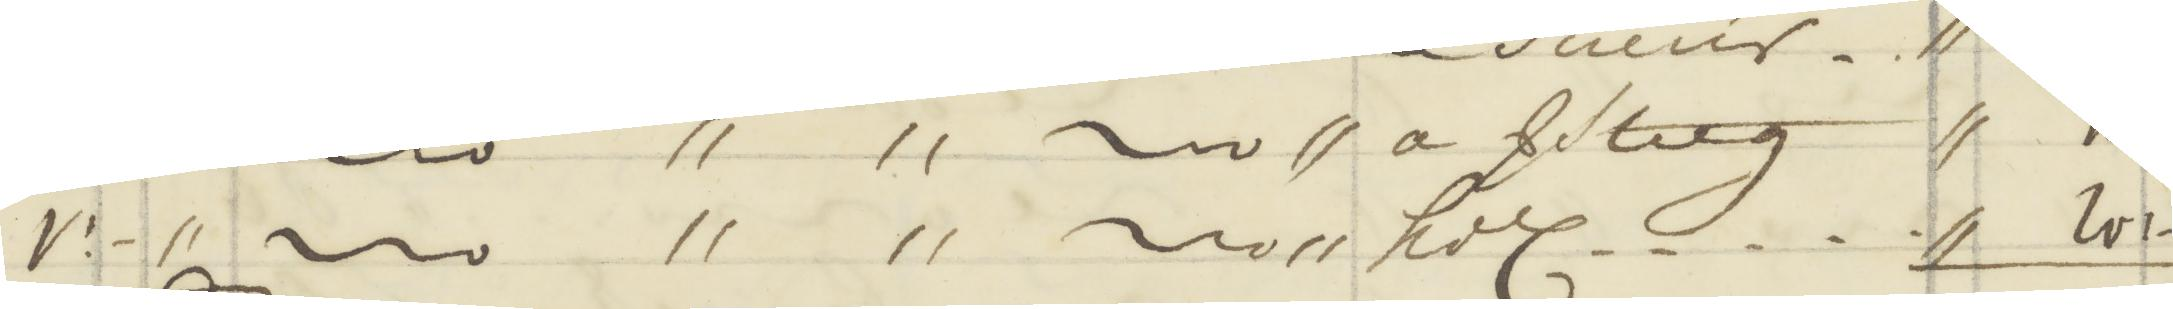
1: „ _o „ „ _o „ kox - - - - - „ 10:
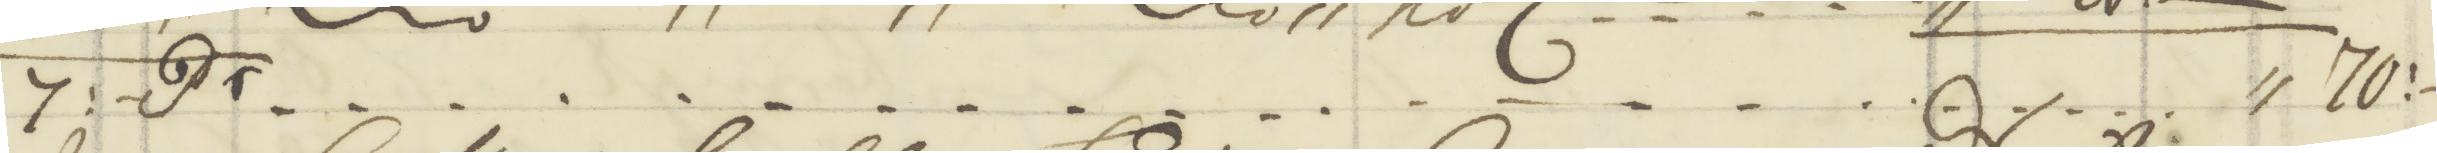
7: Ps . . . .„ 70:
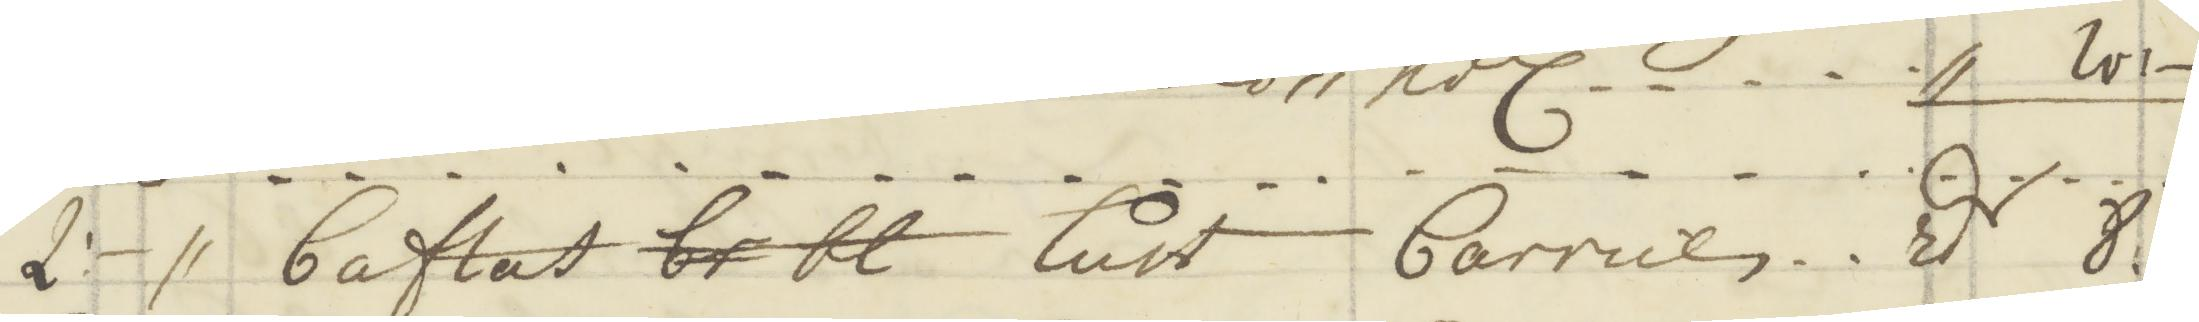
2:- „ baftas br bl Cust barril. . rds 8
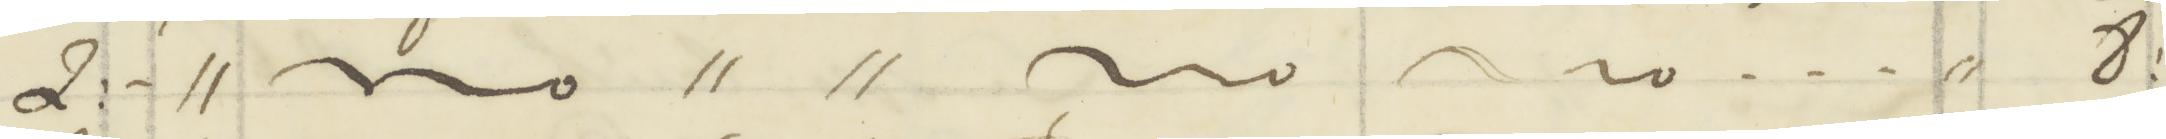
2:- „ _o „ „ _o _o . . . „ 8
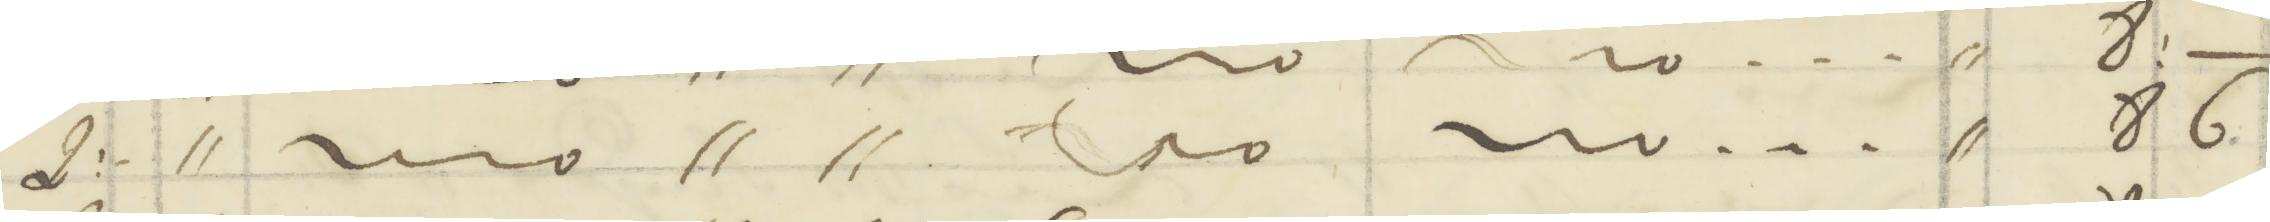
2:- „ _o „ „ _o _o . . . 8 6.
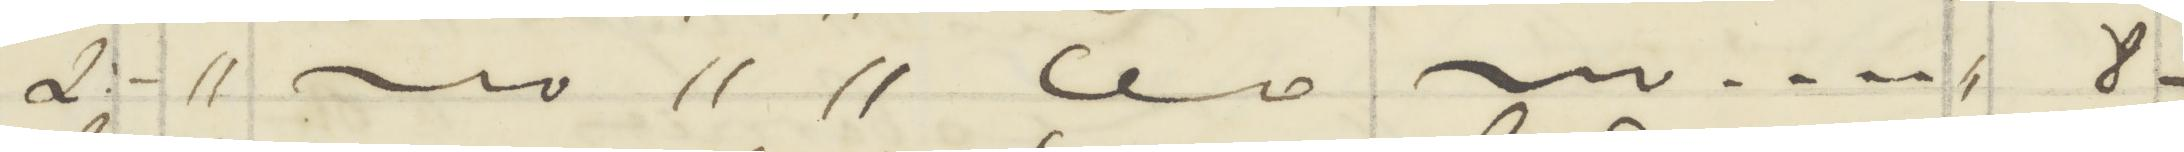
2:- „ _o „ „ _o _o - - - - „ 8
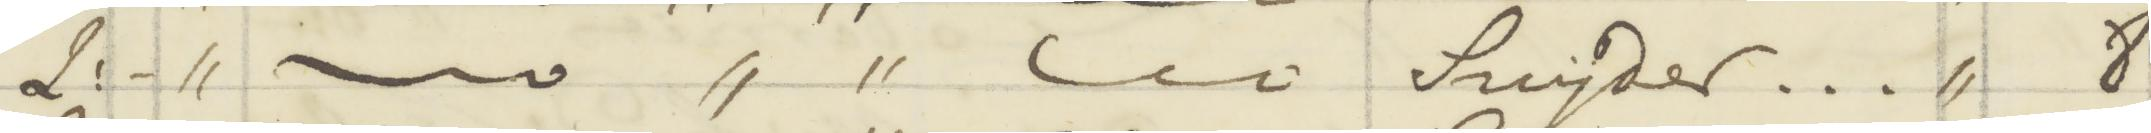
2:- „ _o „ _o suijder . . . „ 8
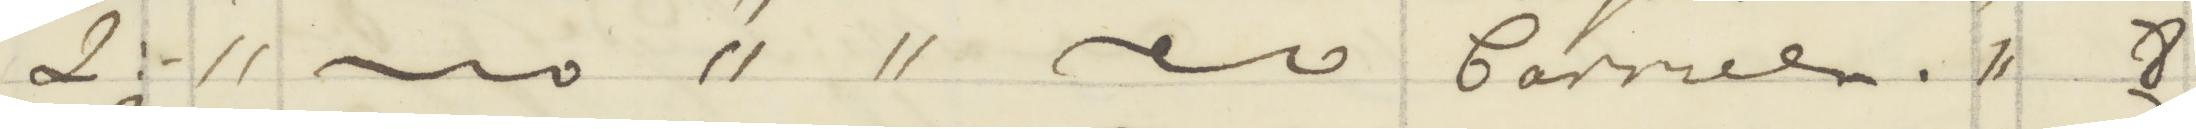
2:- „ _o _o barril . „ 8
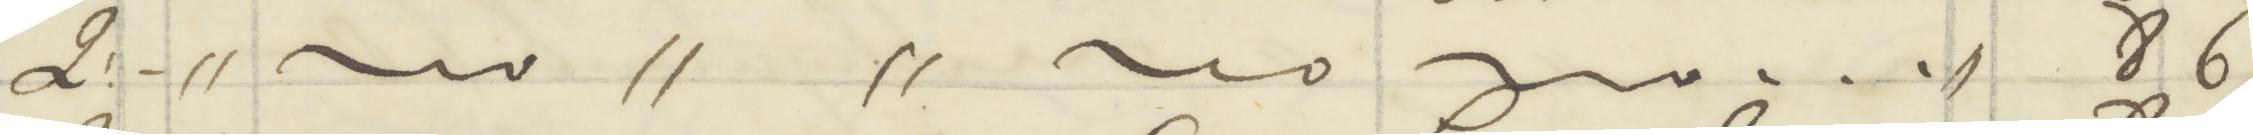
2:- „ _o „ „ _o _o . . 8„ 6
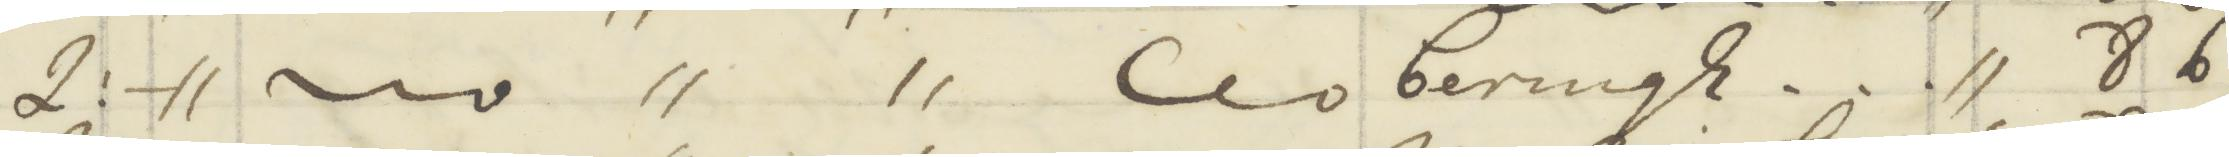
2: „ _o „ „ _o beringh . . . „ 8 6
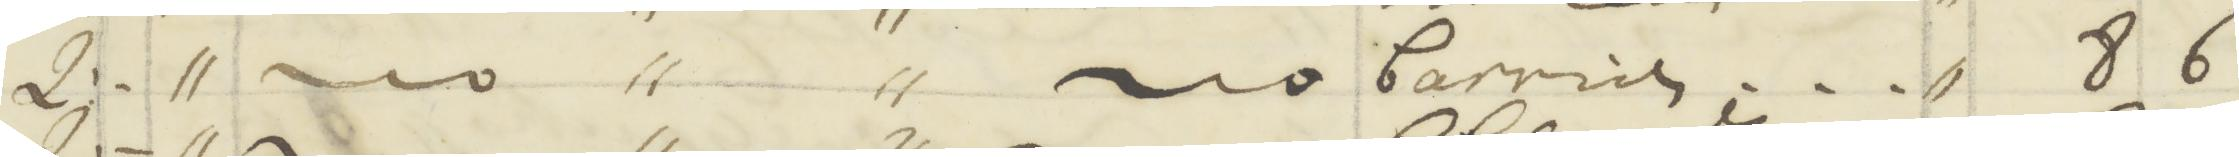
2:- „ _o „ „ _o barril - - - „ 8 6
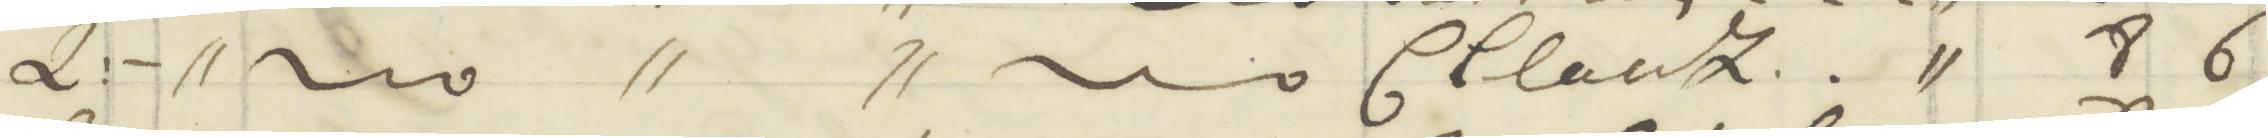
2:- „ do „ „ do c claaz. „ 8 6
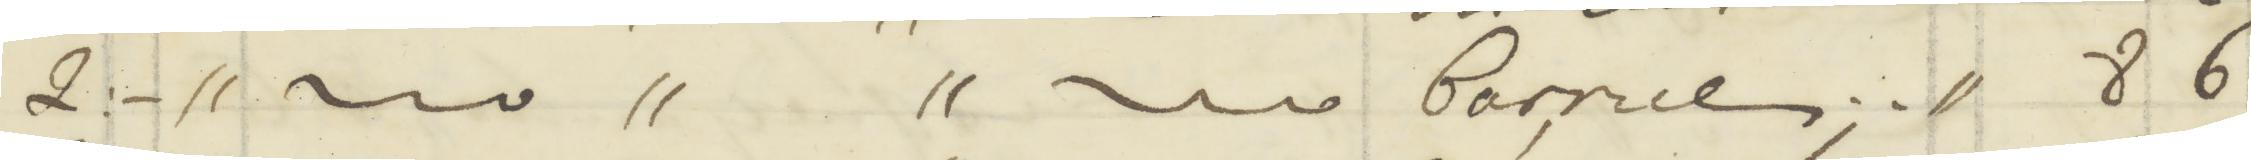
2:- „ _o „ „ _o barril - - „ 8 6
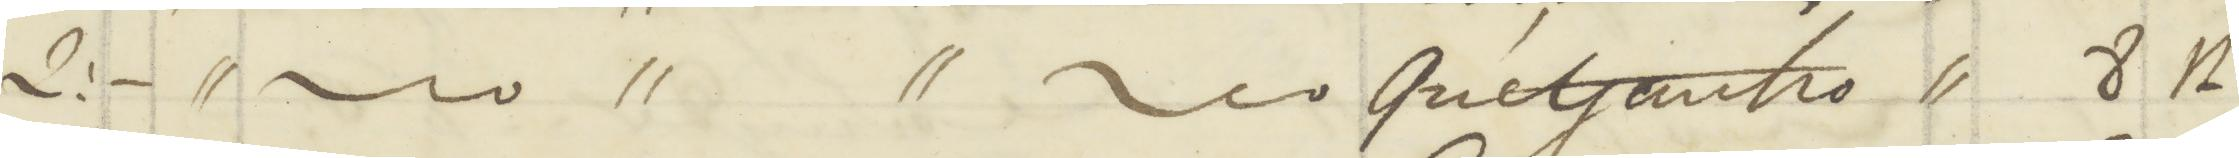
2:- „ _o „ „ _o quetjantro „ 8 12
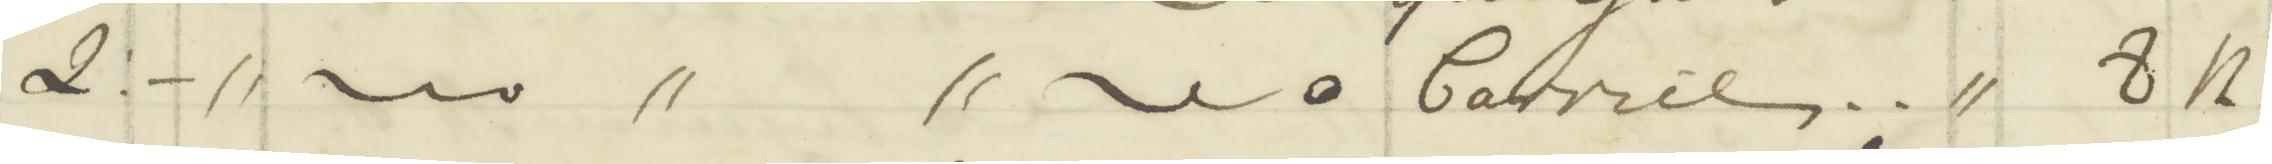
2:- „ _o „ „ _o barril - - „ 8 12
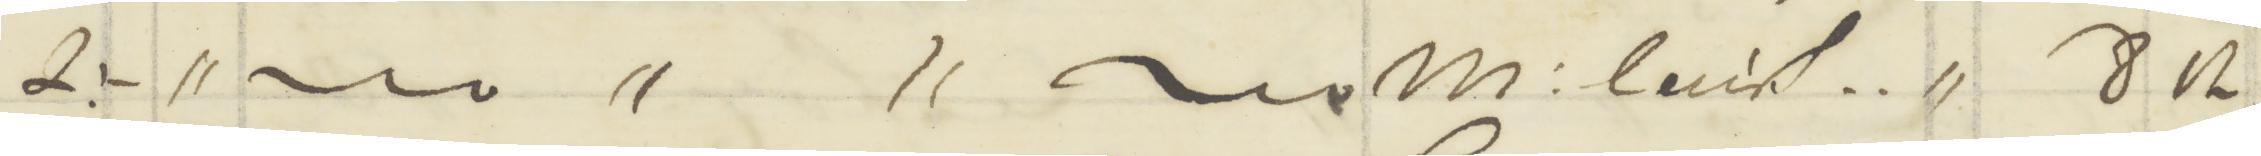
2:- „ _o „ „ _o M: leurs . . „ 8 12
